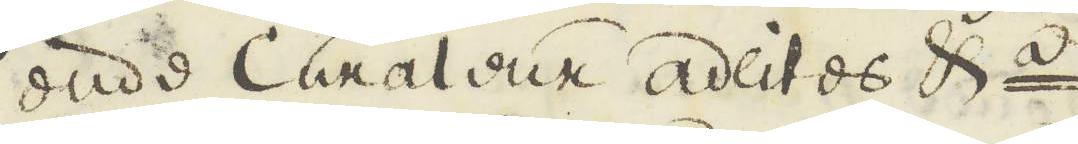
ende Curateur adlites &=a
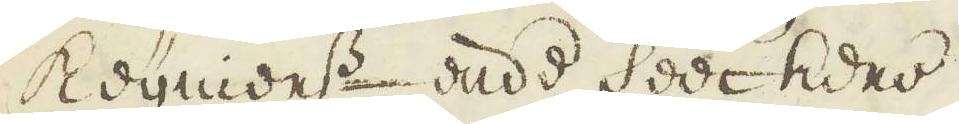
Reijniers= ende seeckere
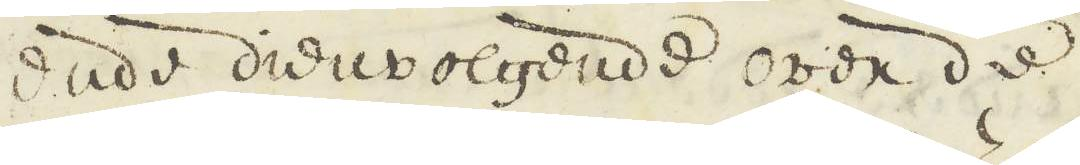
ende dienvolgende over de
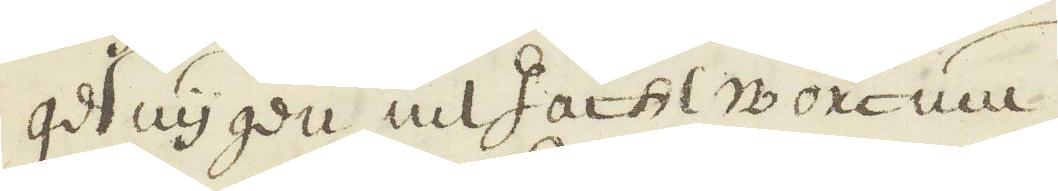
getuijgen int Jacht worcum
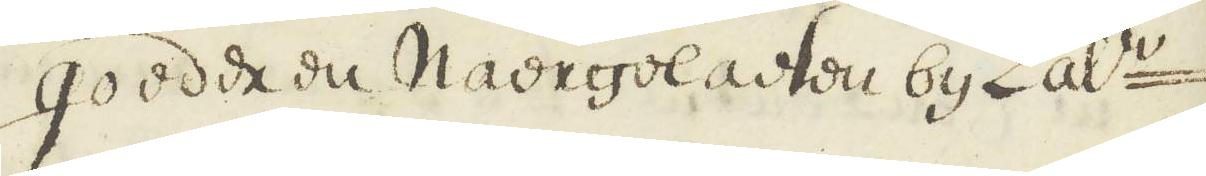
goederen Naergelaeten by zal=r
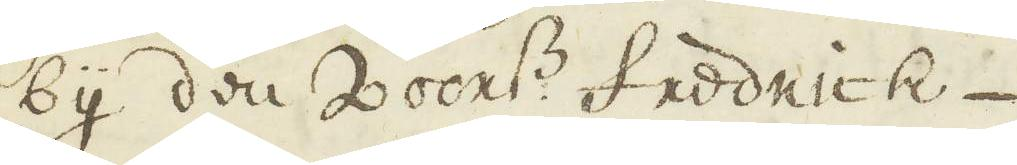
bij den voors: Fredrick _
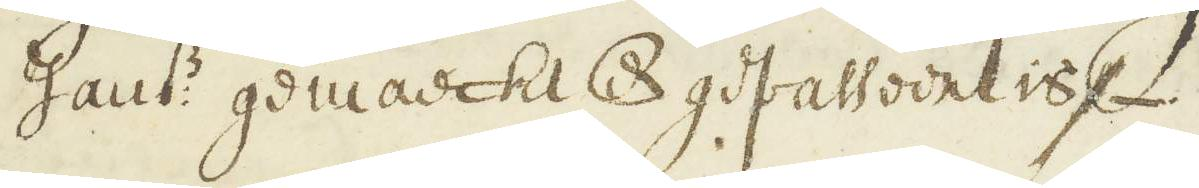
Jans: gemaeckt ende gepasseert is/_
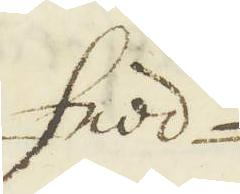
fred=k
